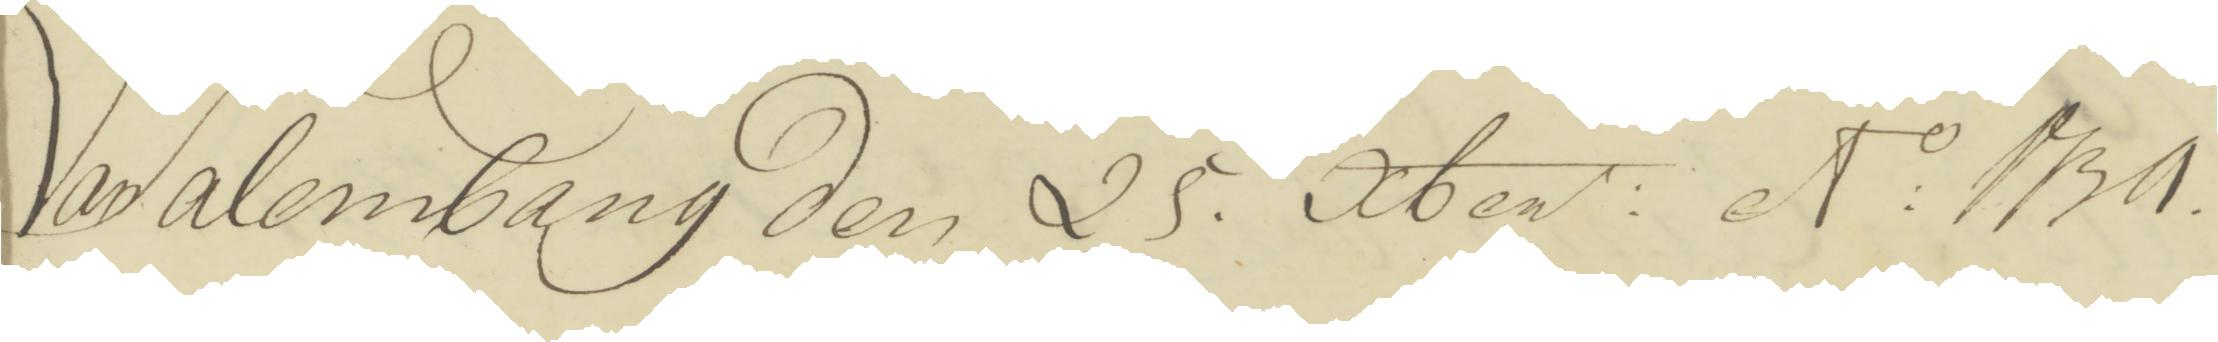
Van Palembang den 25.' xber: A:o 1734.
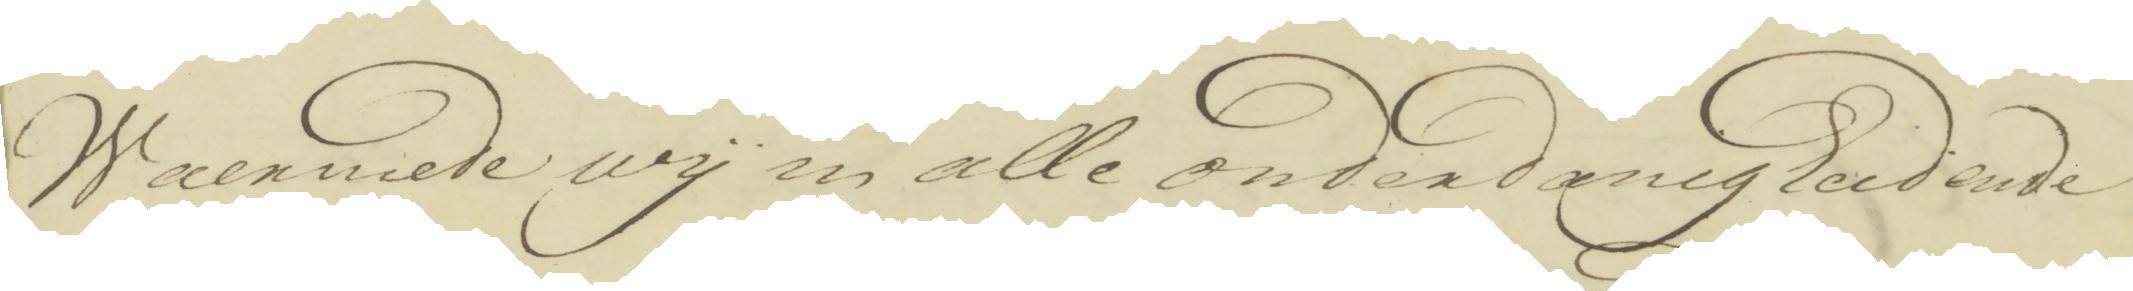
Waermede wij in alle onderdanigheid ende
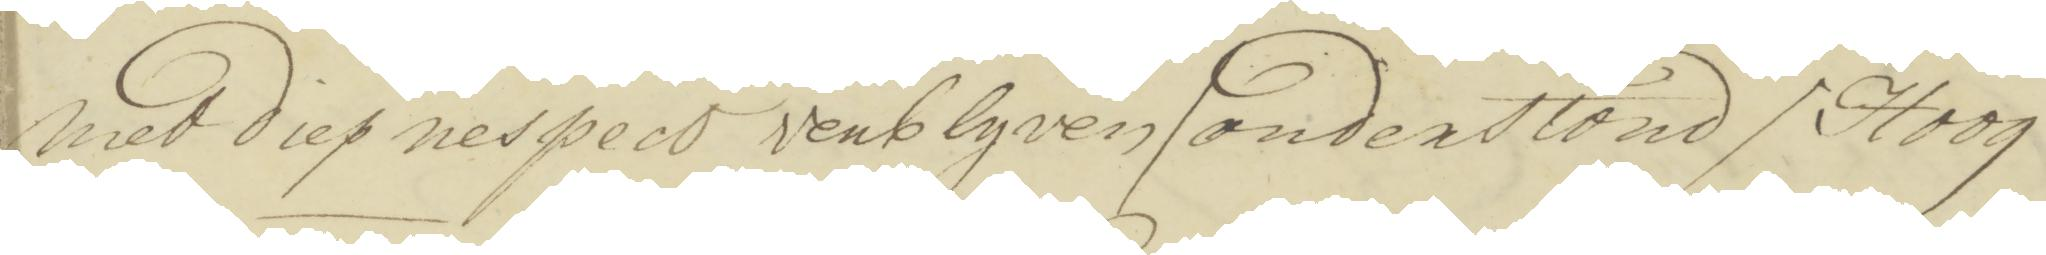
met diep respect verblyven /onderstond/ Hoog
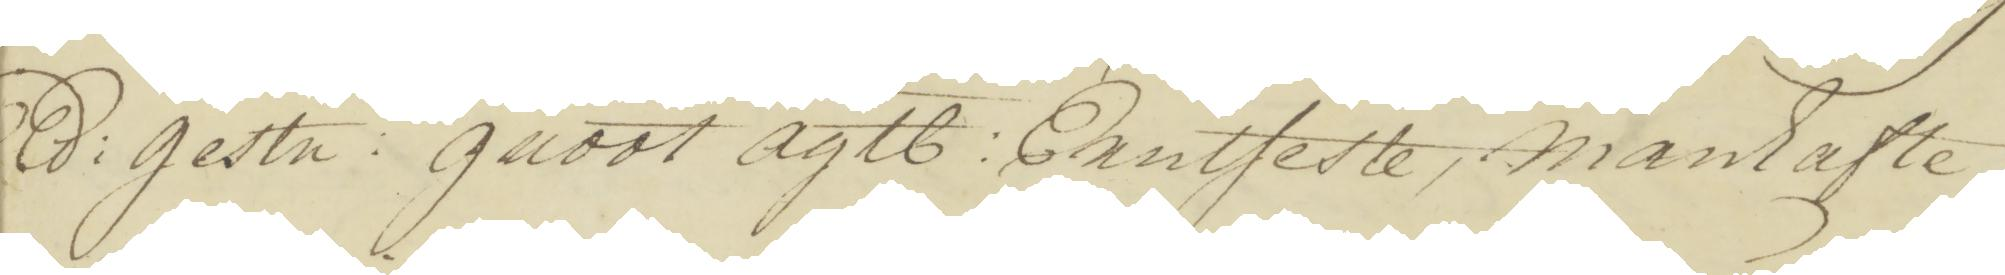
Ed: gestr: groot agtb: Erntfeste, manhafte
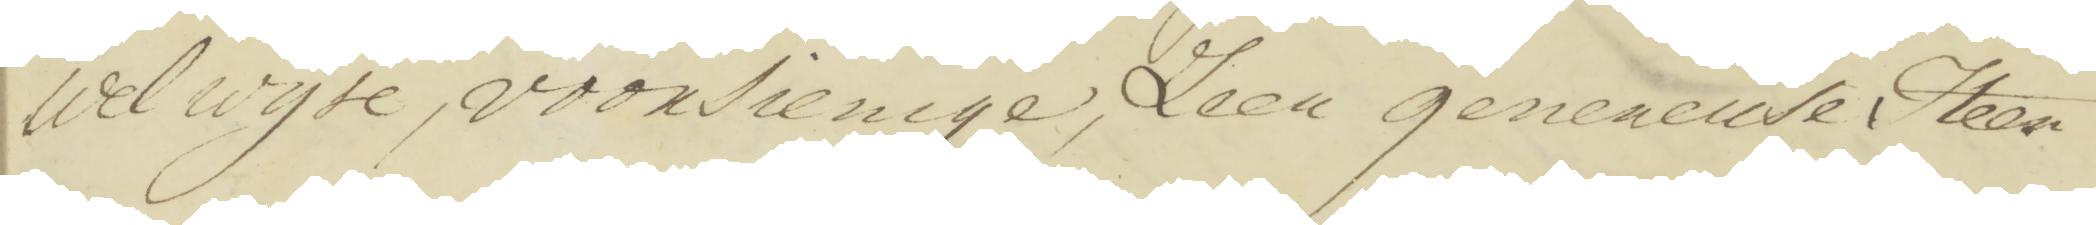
wel wijse, voorsienige, zeer genereuse Heer
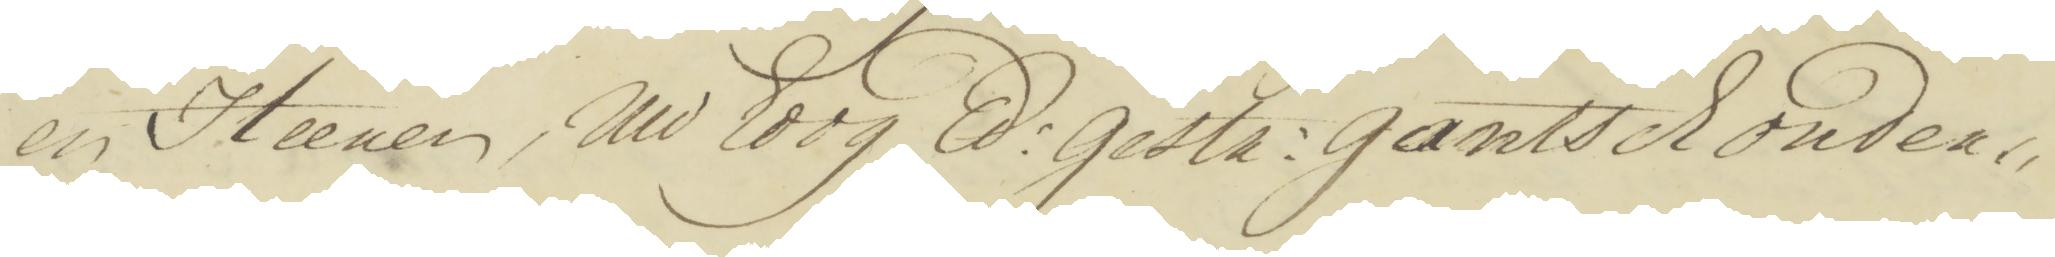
en Heeren, uw hoog Ed: gestr: gantsch onder„
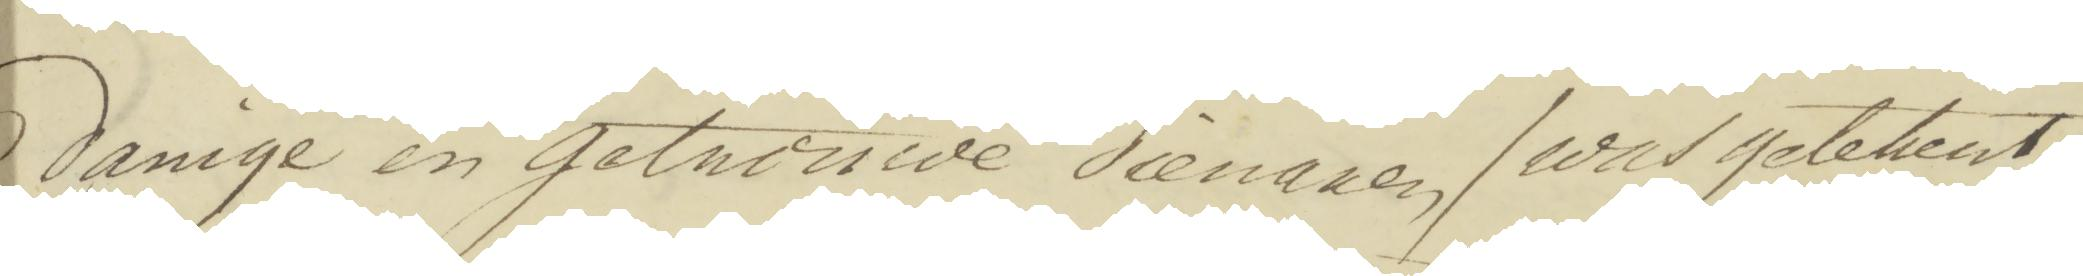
danige en getrouwe dienaren /was getekent/
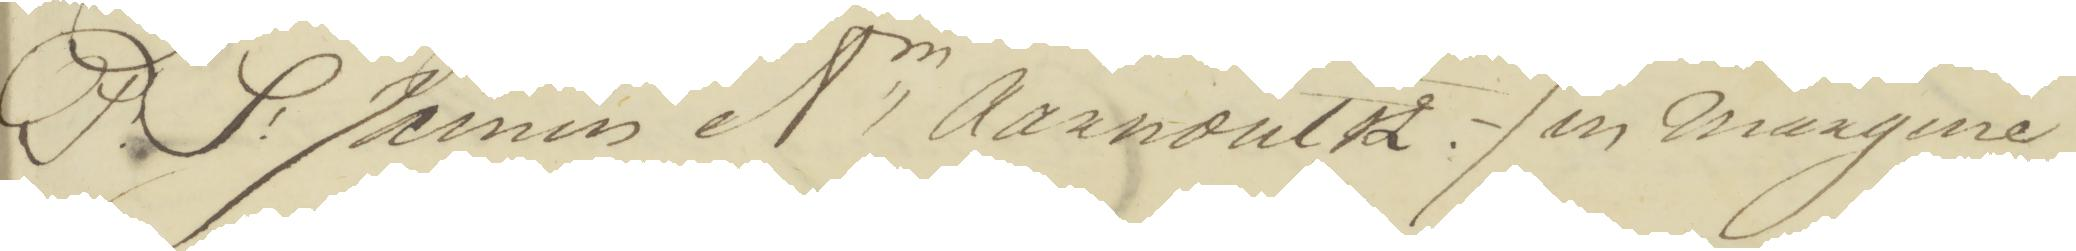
P: S: Jamin A„m Aarnoutsz. - /in margine
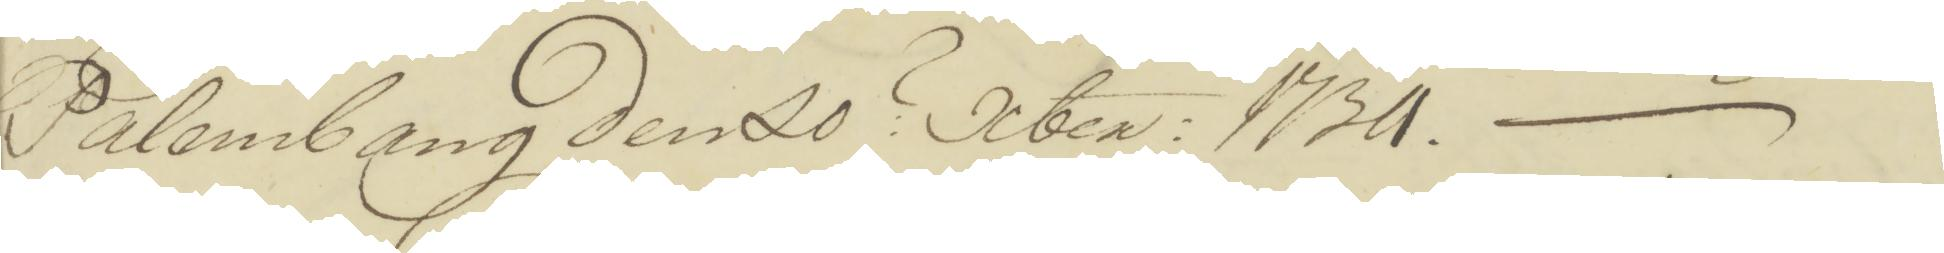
Palembang den 20:' xber: 1734. —
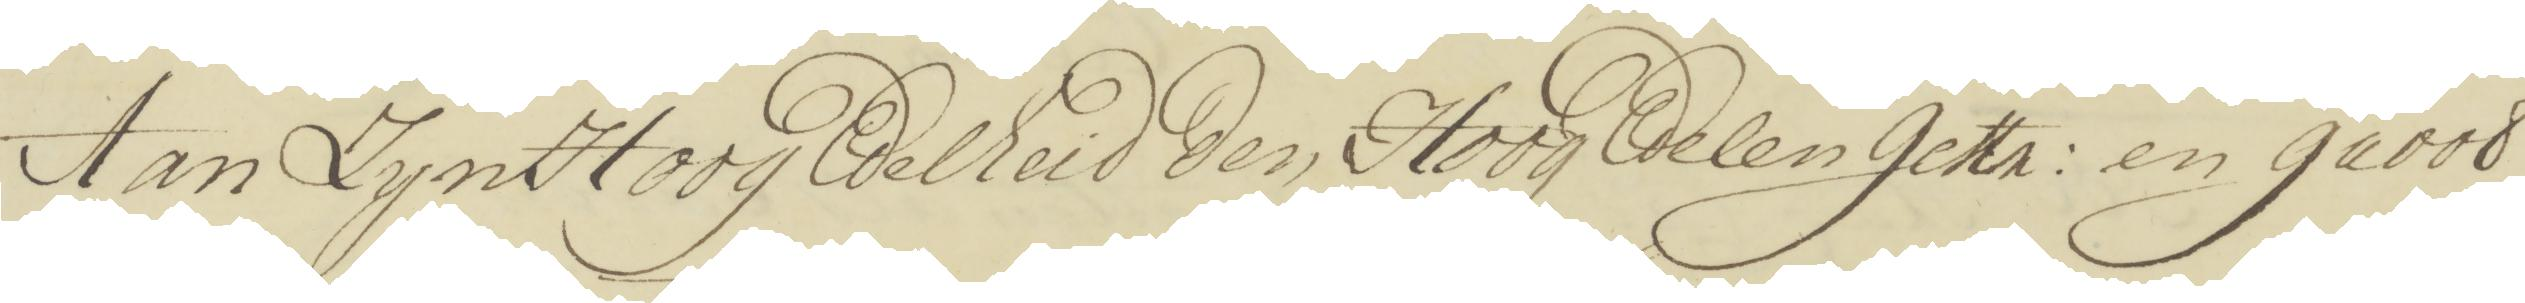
Aan zyn Hoog Edelheid den Hoog Edelen Gestr: en groot
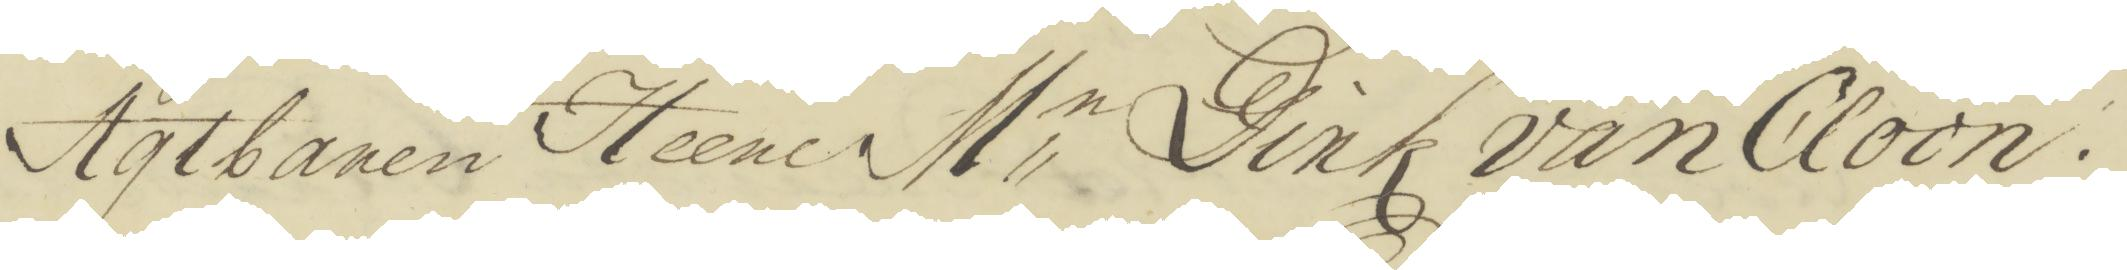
Agtbaren Heere M„r Dirk van Cloon.
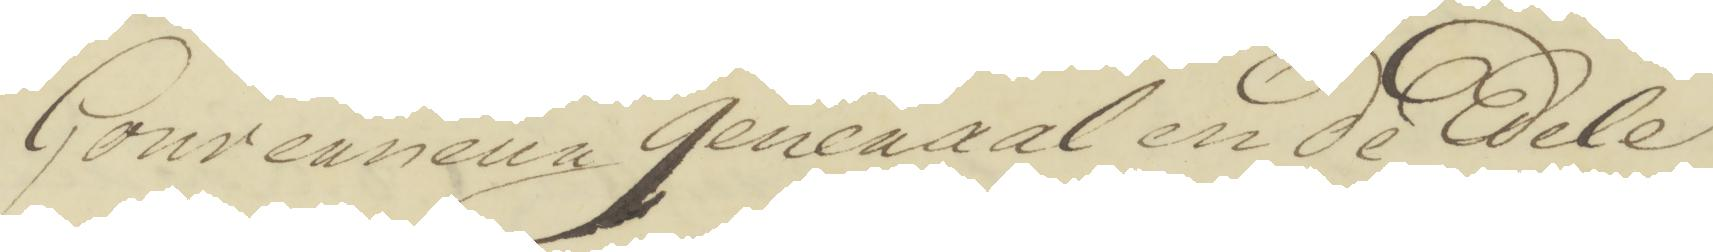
Gouverneur Generaal en de Edele
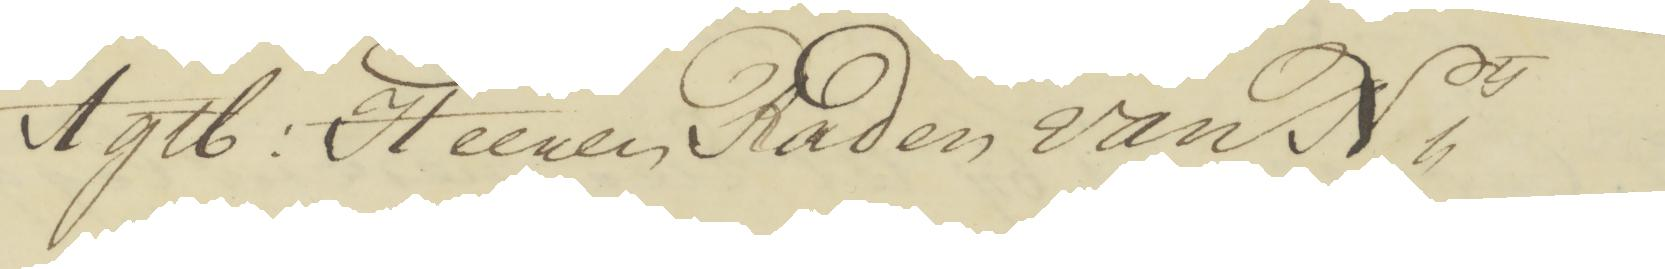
Agtb: Heeren Raden van N„ts
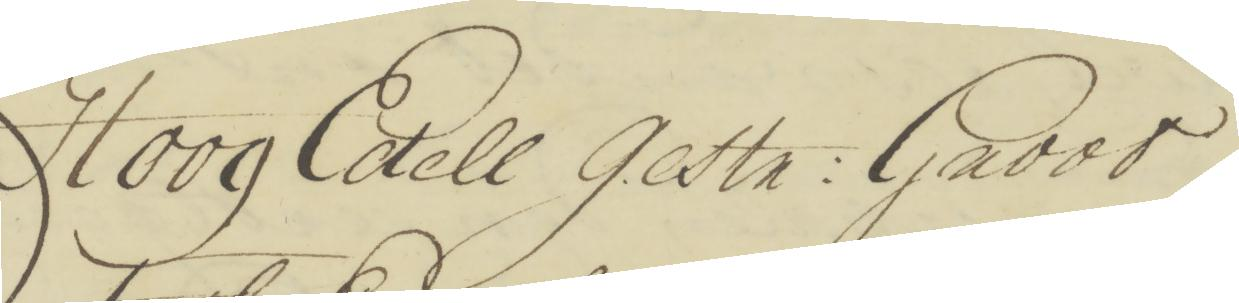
Hoog Edele Gestr: Groot
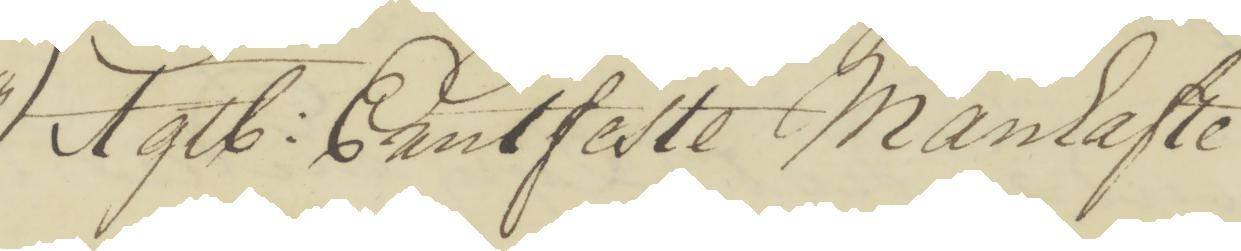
Agtb: Erntfeste Manhafte
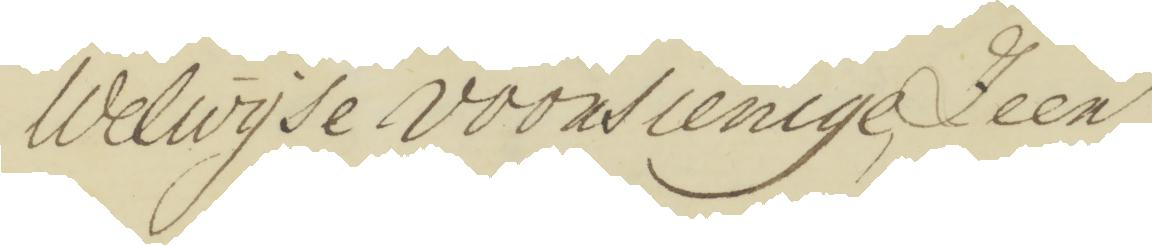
Welwijse voorsienige, zeer
